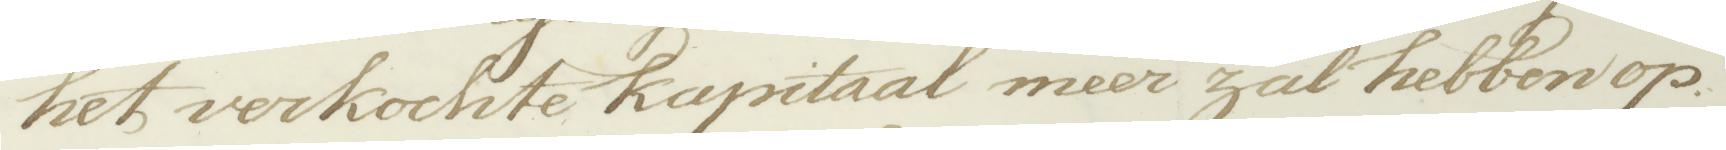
het verkochte kapitaal meer zal hebben op.
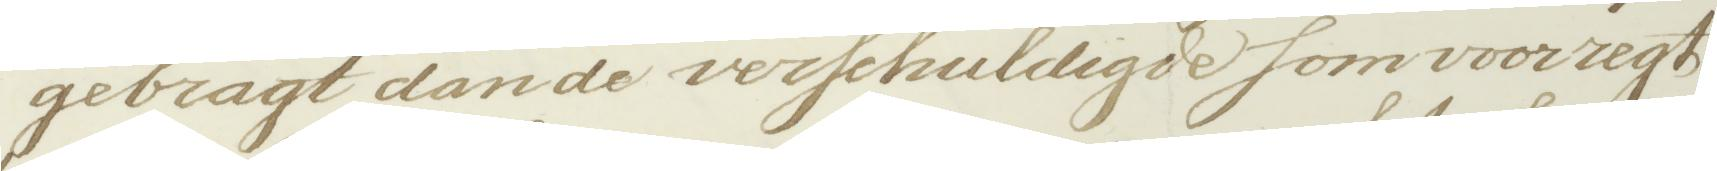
gebragt dan de verschuldigde som voor regt
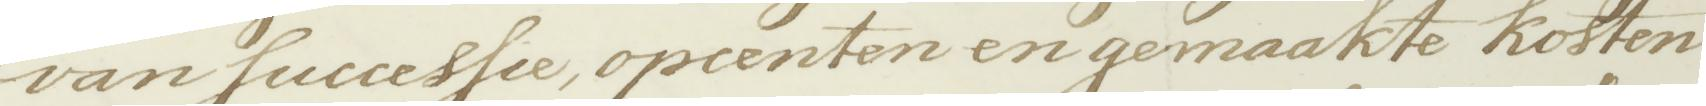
van successie, opcenten en gemaakte kosten
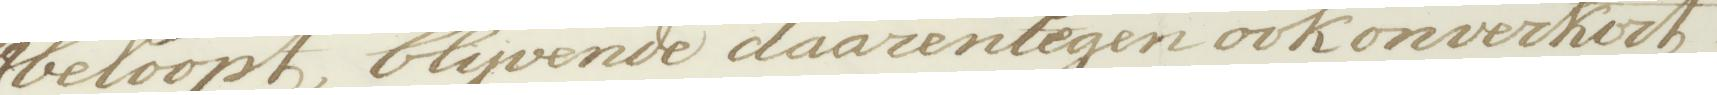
beloopt, blijvende daaren tegen ook onverkort
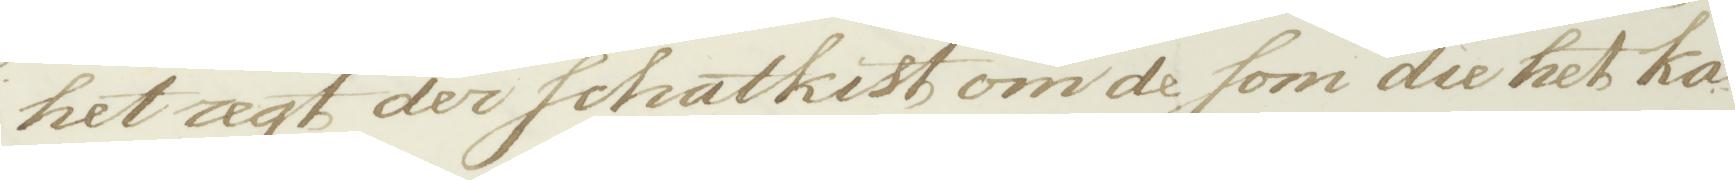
het regt der schatkist om de som die het ka
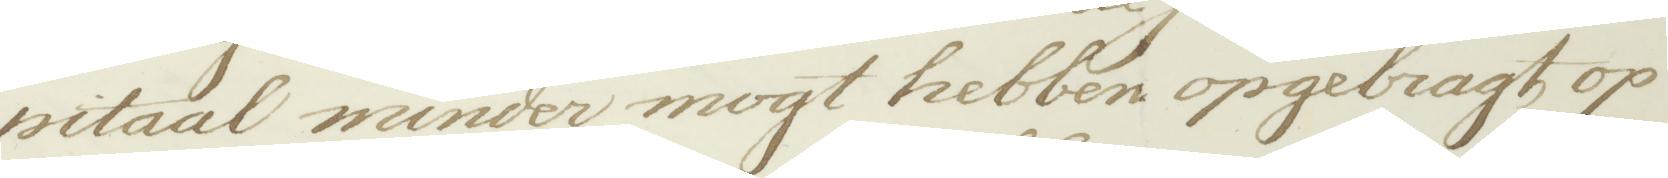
pitaal minder mogt hebben opgebragt op
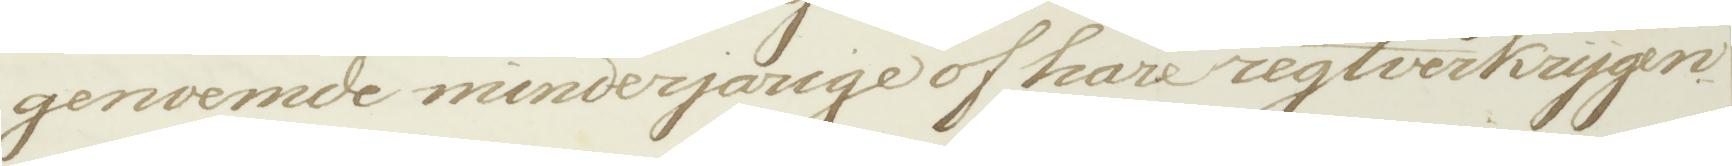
genoemde minderjarige of hare regtverkrijgen„
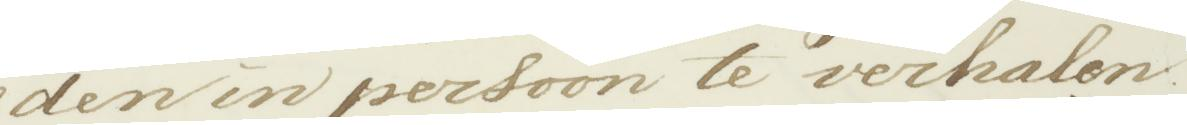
den in persoon te verhalen:
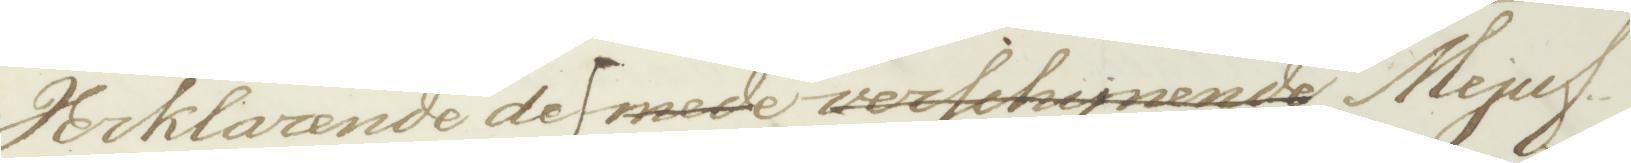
Verklarende de ¶ mede verschijnende Mejuf.-
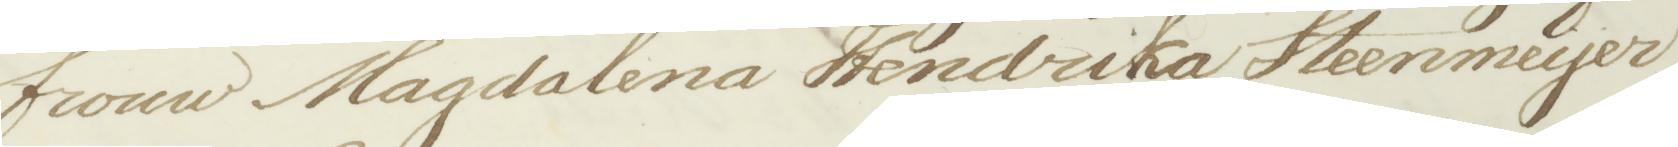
frouw Magdalena Hendrika Steenmeijer
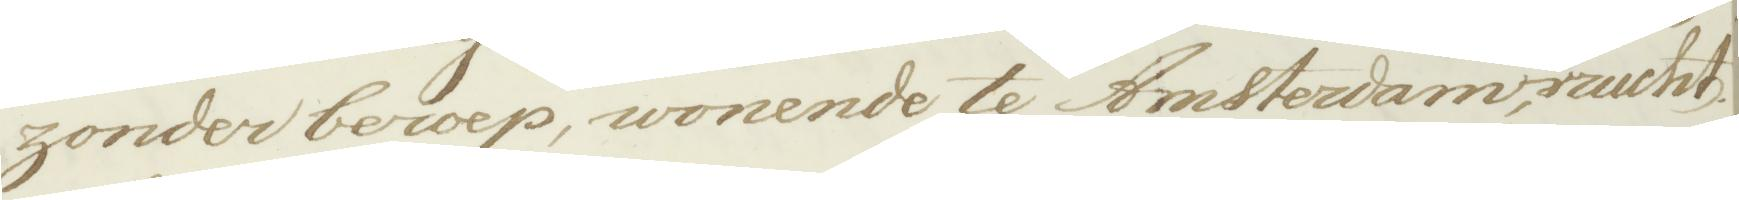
zonder beroep, wonende te Amsterdam, vrucht.
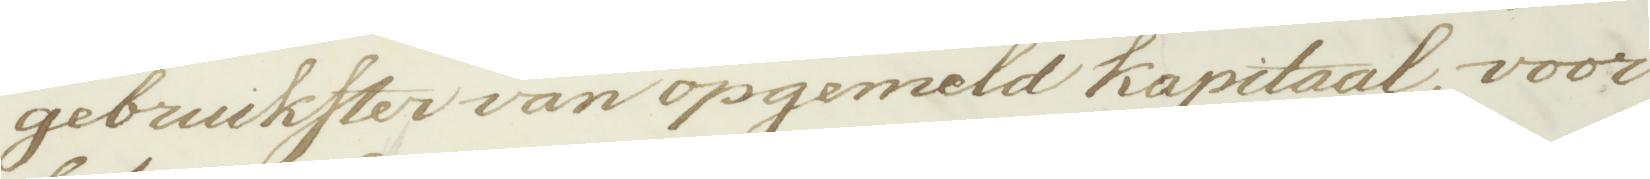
gebruikster van opgemeld kapitaal, voor
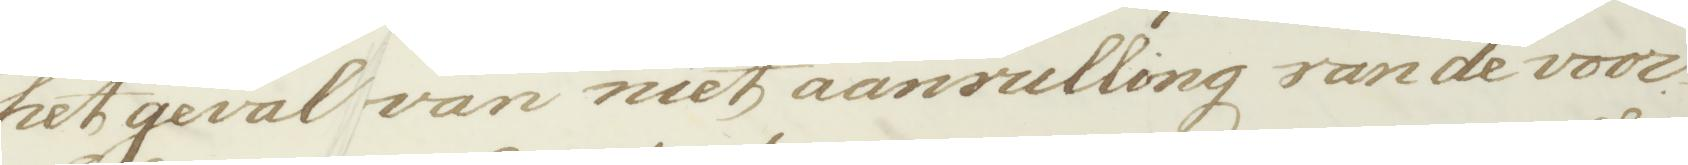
het geval van niet aanvulling van de voor.
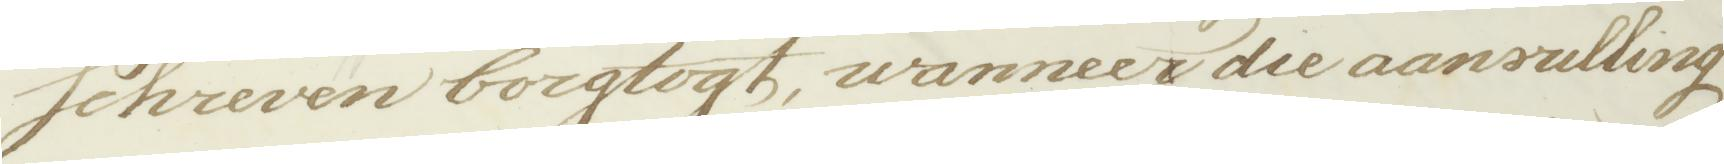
schreven borgtogt, wanneer die aanvulling
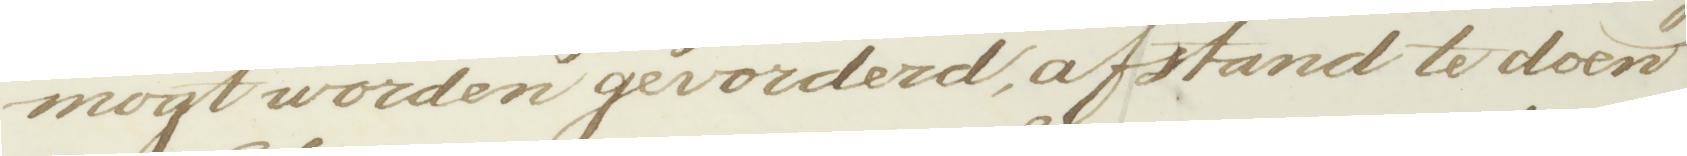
mogt worden gevorderd, afstand te doen
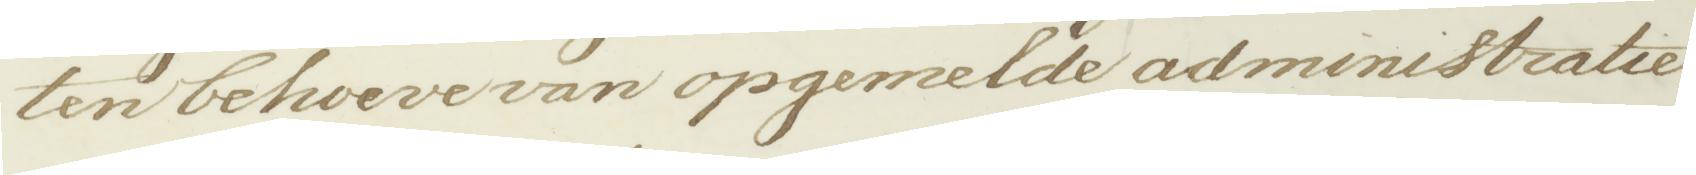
ten behoeve van opgemelde administratie
